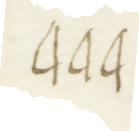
444
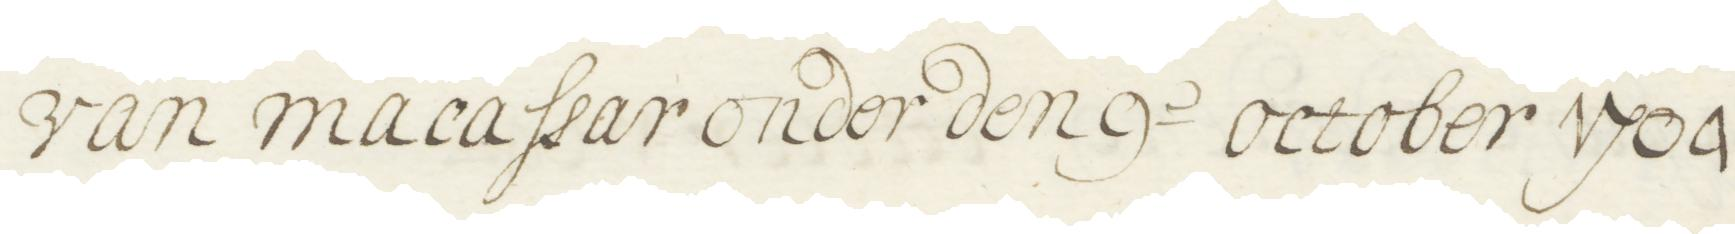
van macassar onder den 9-' october 1704
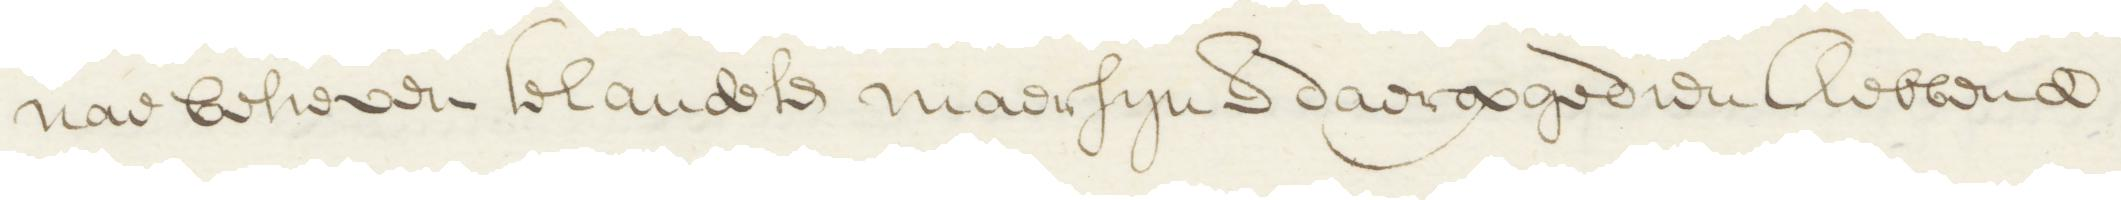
nae believen te handelen maer sijn E daer op gedient hebbend
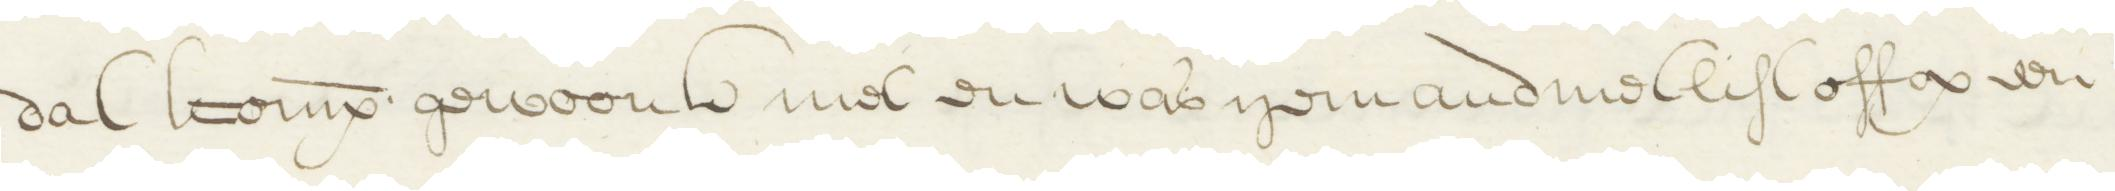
dat tcomp: gewoonte niet en was yemand met list off op een
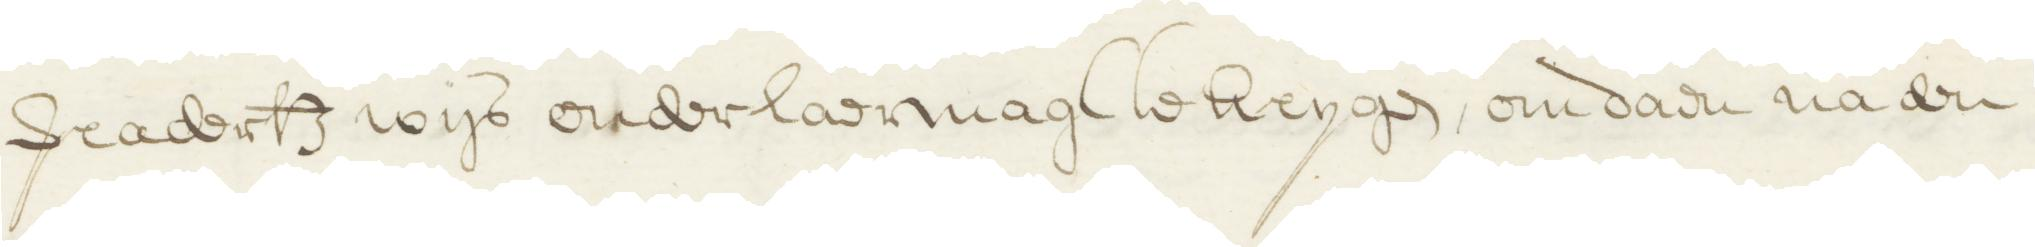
verraderlijk wijs onder haer magt te krygen, om daer na den
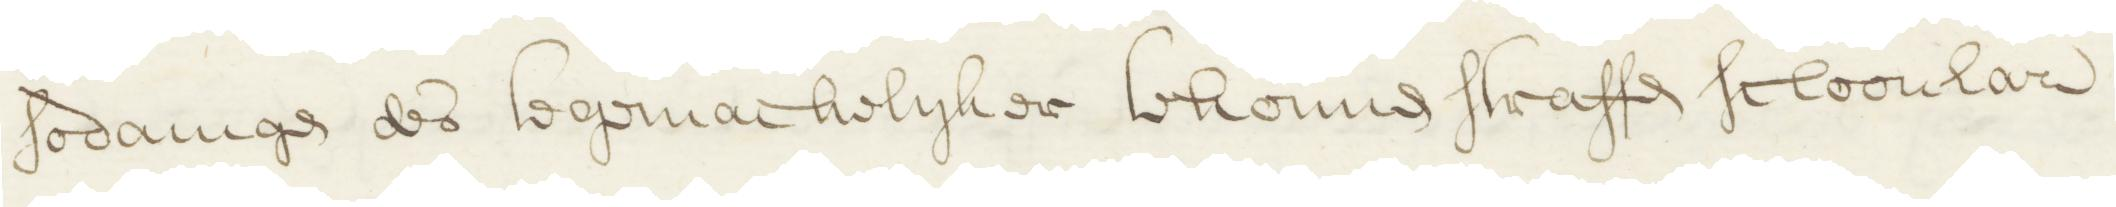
sodanigen des te gemackelyker te konnen straffen schoon hare
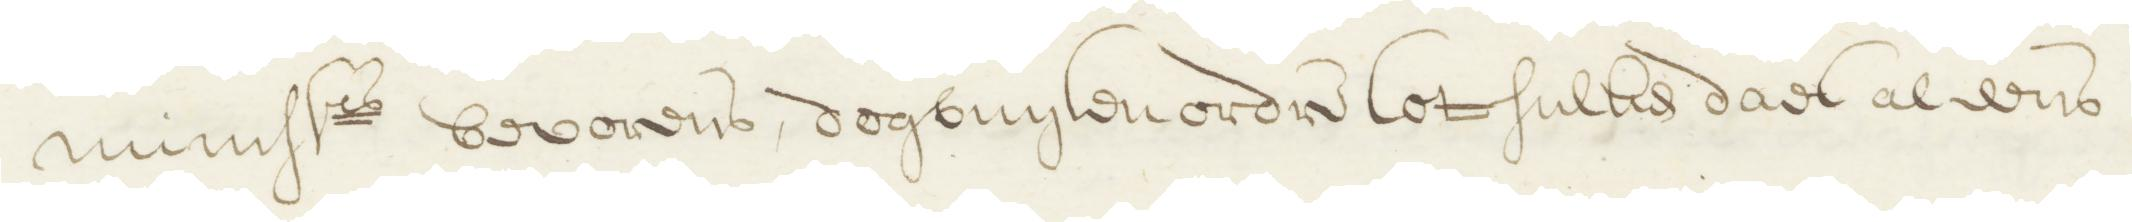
minist=es bevorens, dog buyten ordre tot sulken daet al eens
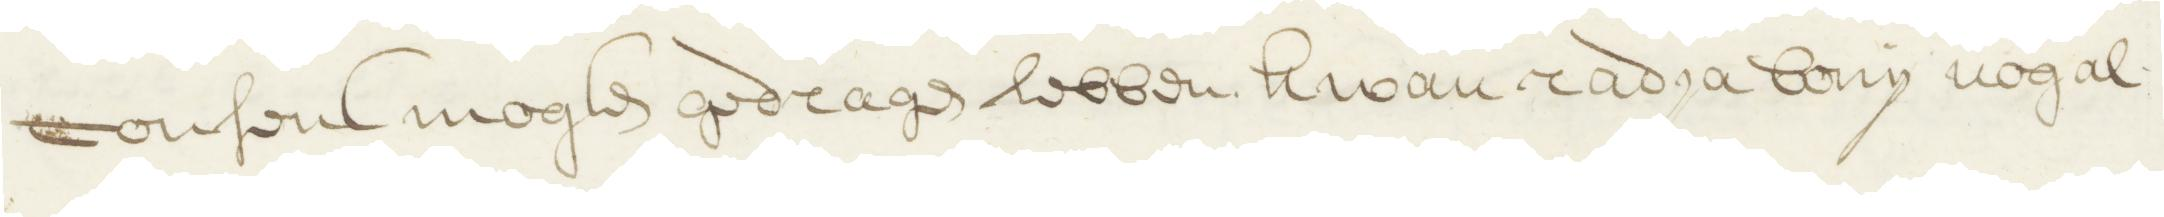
consent mogten gedragen hebben. kwan radja bonij nog al
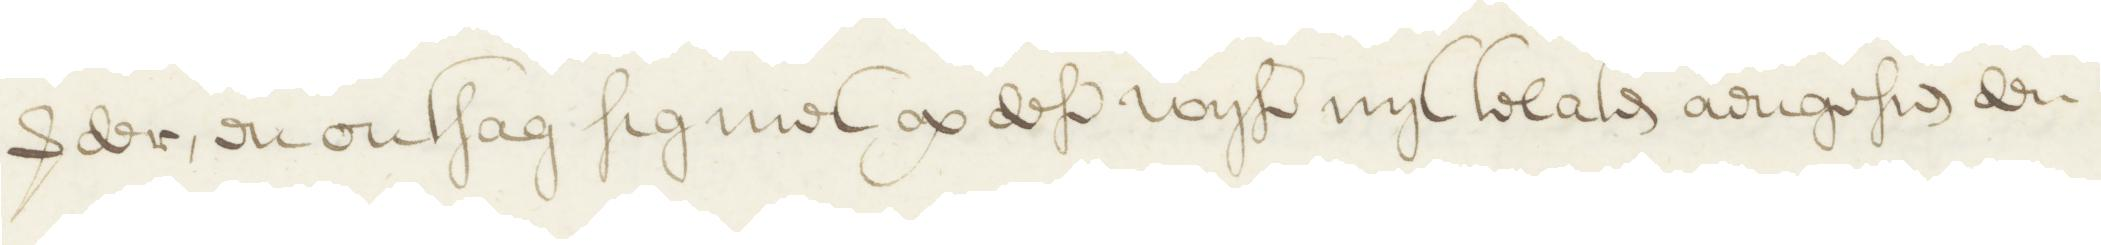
verder, en ontsag sig niet op dese wyse uyt telaten aengesien den
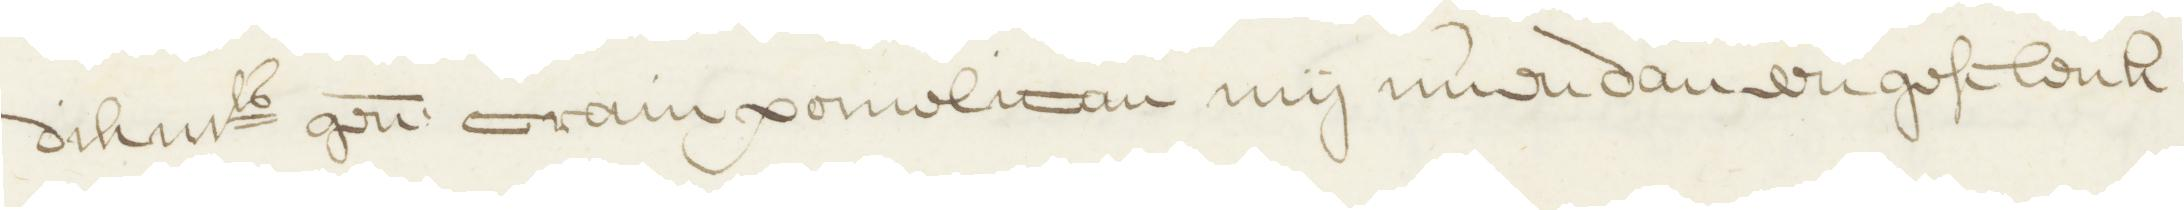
dikw=ls gen: crain pomelican mij nu en dan een geschenk
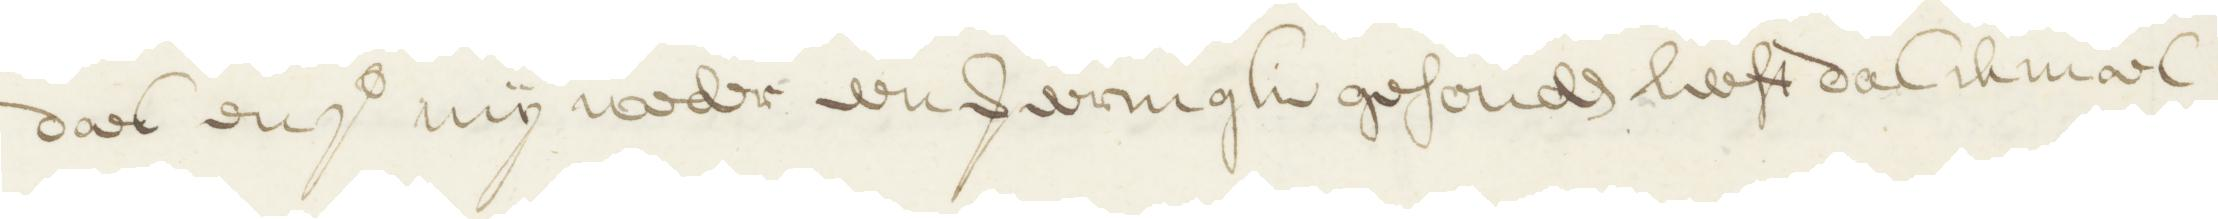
doet en jo mij weder een vereering te gesonden heeft dat ik moet
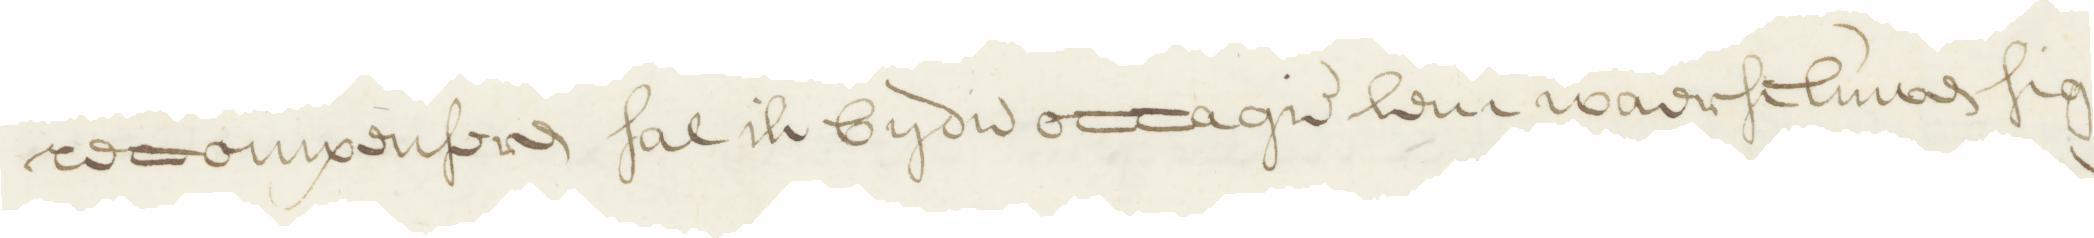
recompenseren sal ik by die occagie hem waerschuwen sig
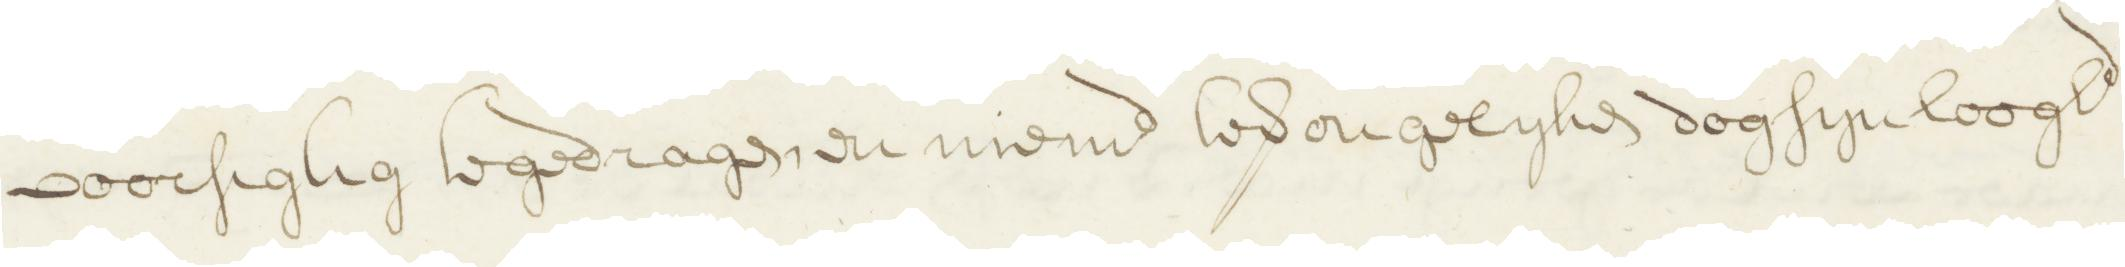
voorsigtig te gedragen, en niemd teverongelyken dog syn hooghd
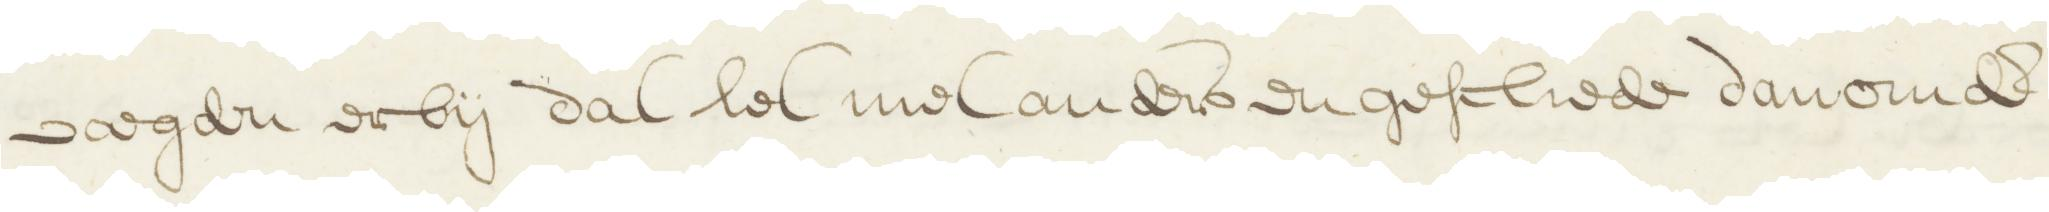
voegden erbij dat het niet anders en geschiede dan om dE
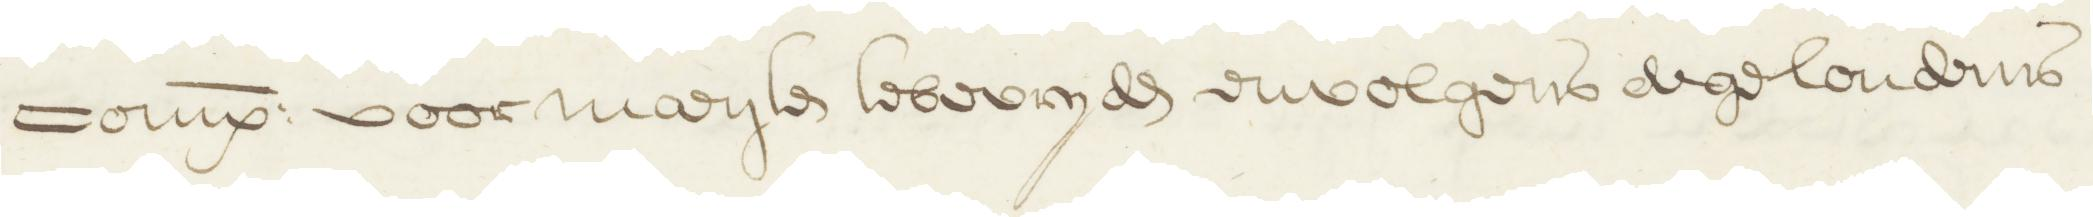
comp: voor moeyten te bevryden en volgens de gehoudens
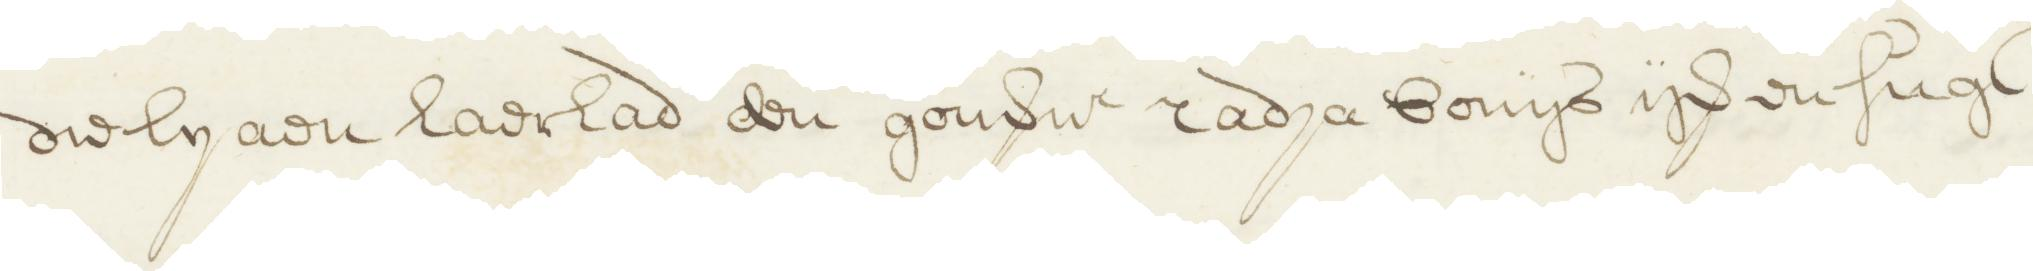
die hy aen haer had den gouverne radja bonijs ijver en sugt
